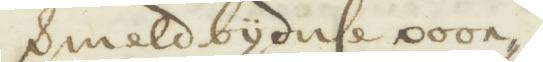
vermeld bij dese voor„
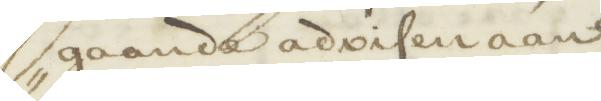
„gaande advisen aan
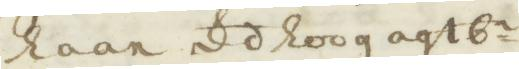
haar Ed hoog agtb:n
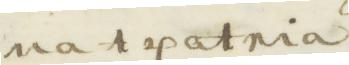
na t patria
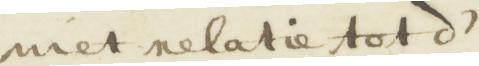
met relatie tot d’
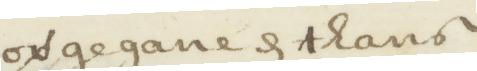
overgegane en thans
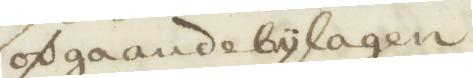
overgaande bijlagen
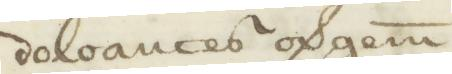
doloances over gem
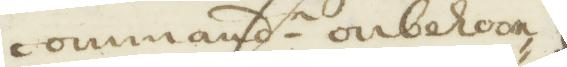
command=r onbehoor„
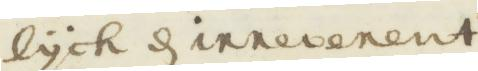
lijck en irreverent
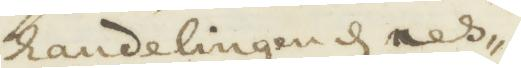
handelingen en res„
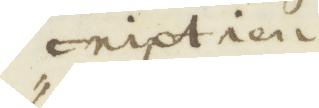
„criptien
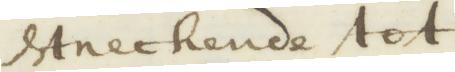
streckende tot
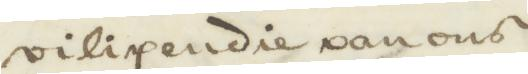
vilipendie van ons
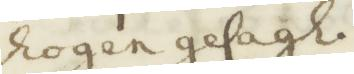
hoger gesagh.
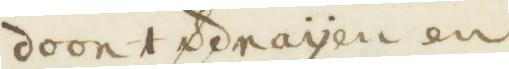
door t verdraijen en
